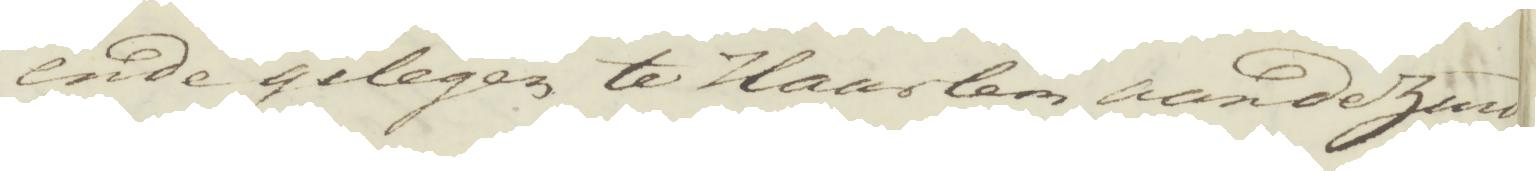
ende gelegen te Haarlem aan de Zuid
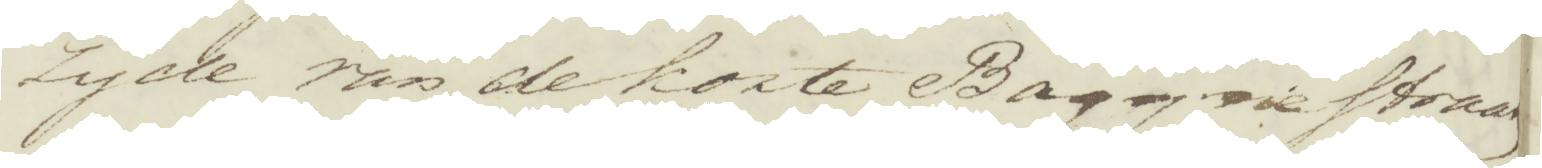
zyde van de korte Bagijne straat
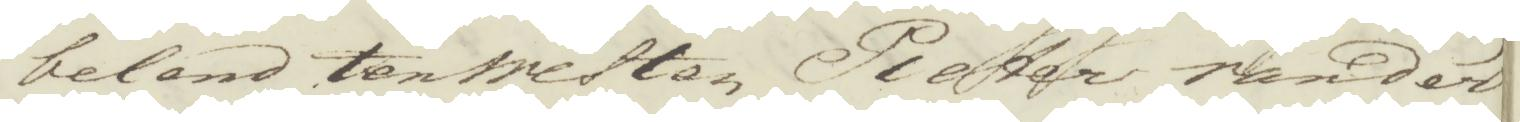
beland ten westen Pieter van der
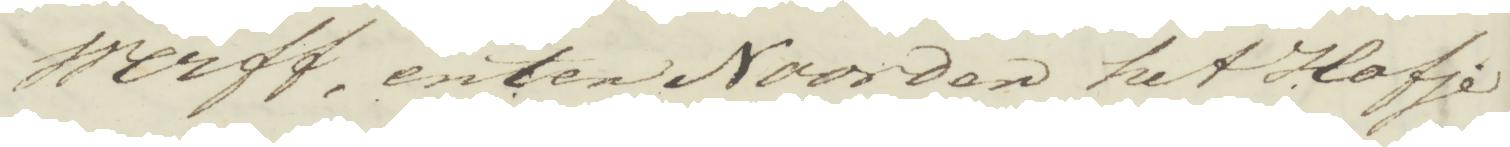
werff, en ten Noorden het Hofje
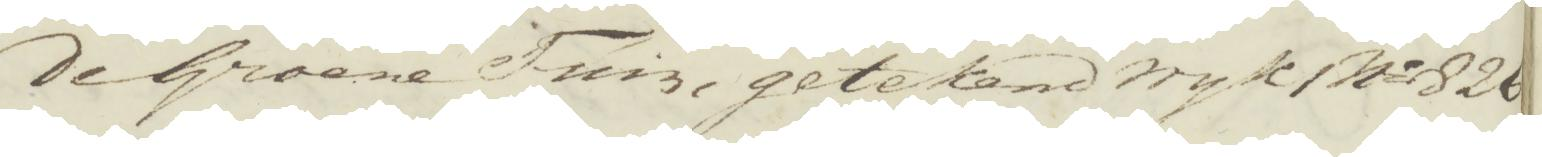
de Groene Tuin getekend wyk 1 N=o 826
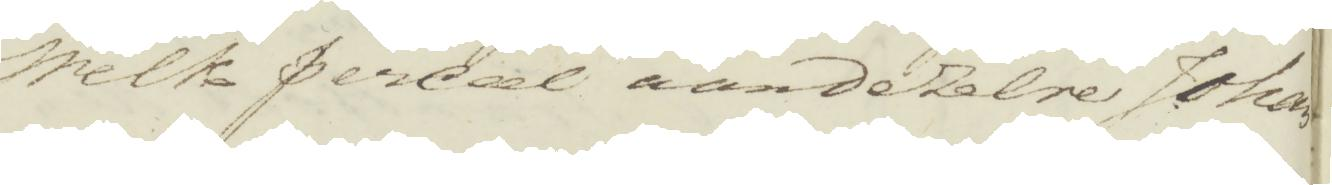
welk perceel aan dezelve Johan
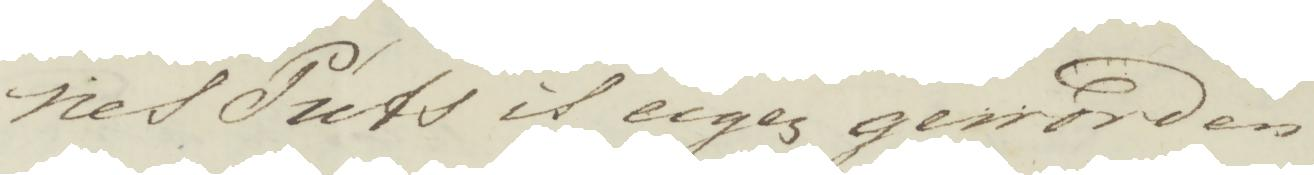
nes Puts is eigen geworden
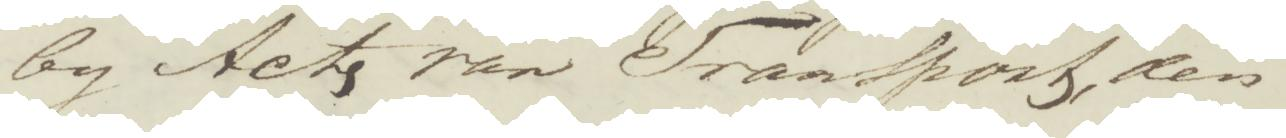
by Acten van Transport, den
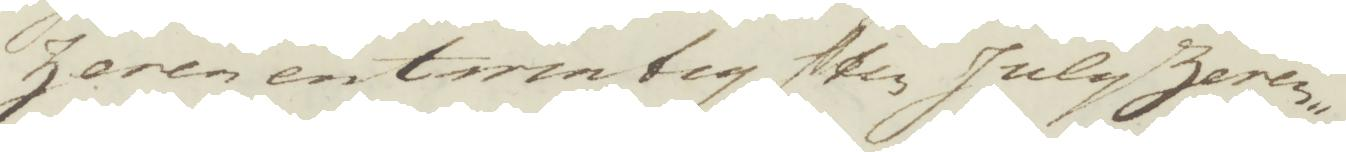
Zeven en twintigsten July Zeven„
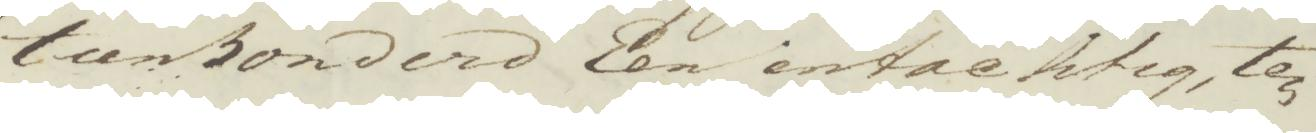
tienhonderd Een en tachtig, ten
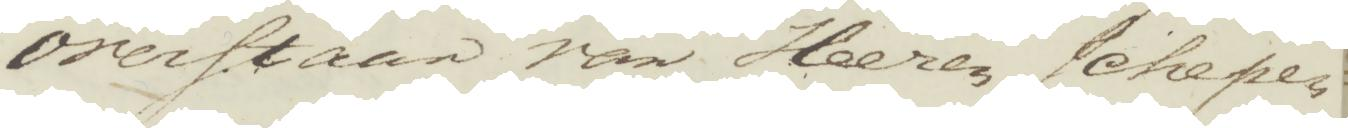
overstaan van Heeren schepen
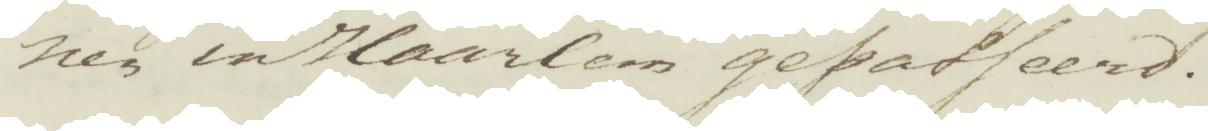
nen in Haarlem gepasseerd.
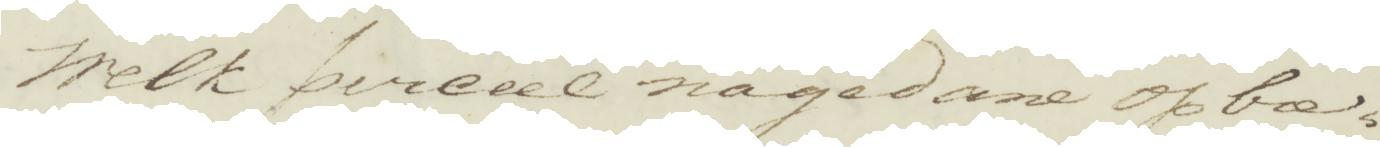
Welk perceel nagedane op bie„
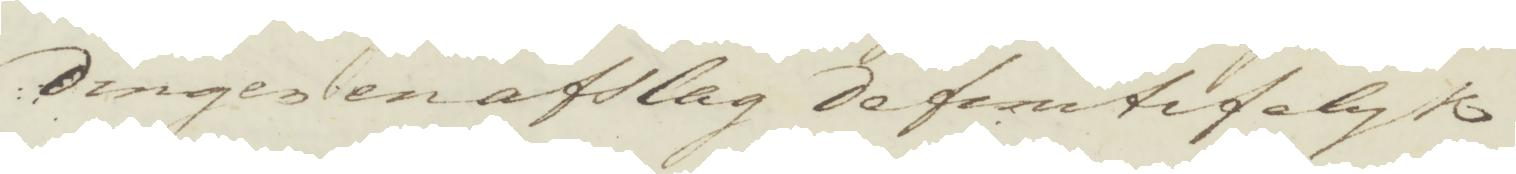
„dingen en afslag definitifelyk
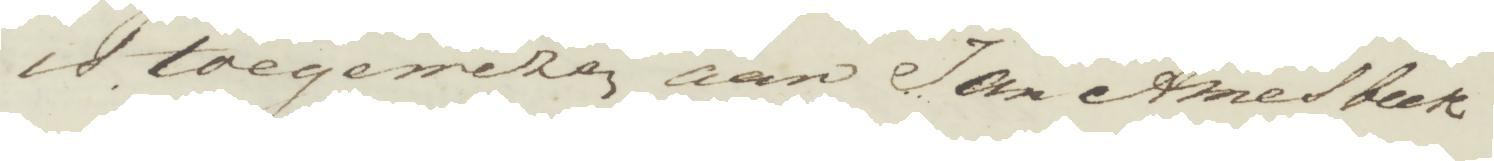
is toegewezen aan Jan Amesbeek
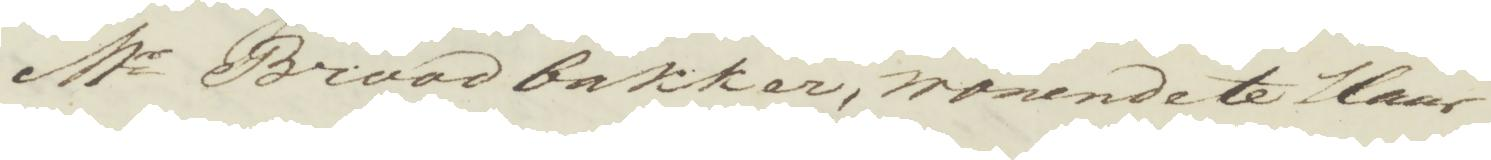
M=r Broodbakker, wonende te Haar
